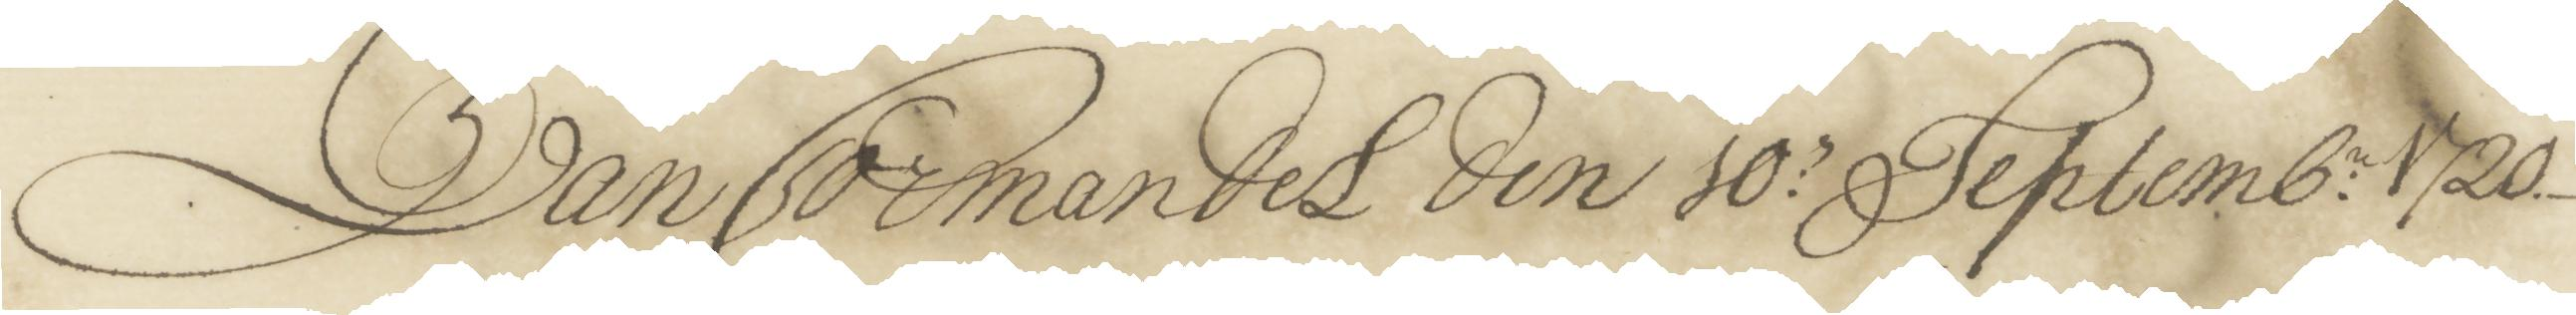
Van Cormandel den 10:en Septemb:r 1720. —
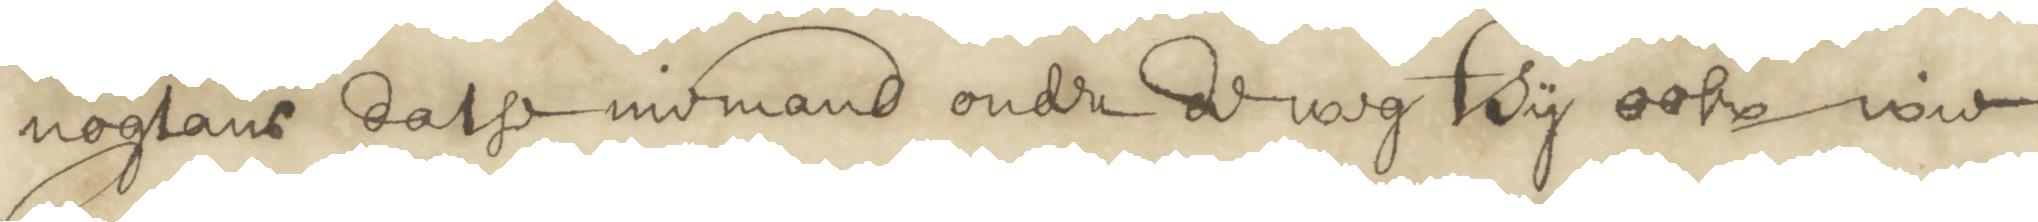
nogtans datse niemand onder de weg tsij ook wie
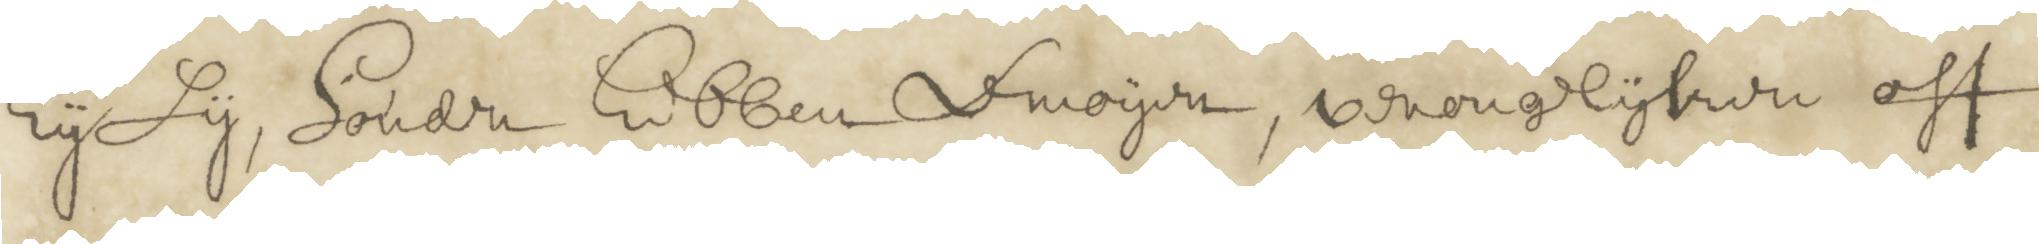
hij sij, souden hebben temoijen, verongelijken off
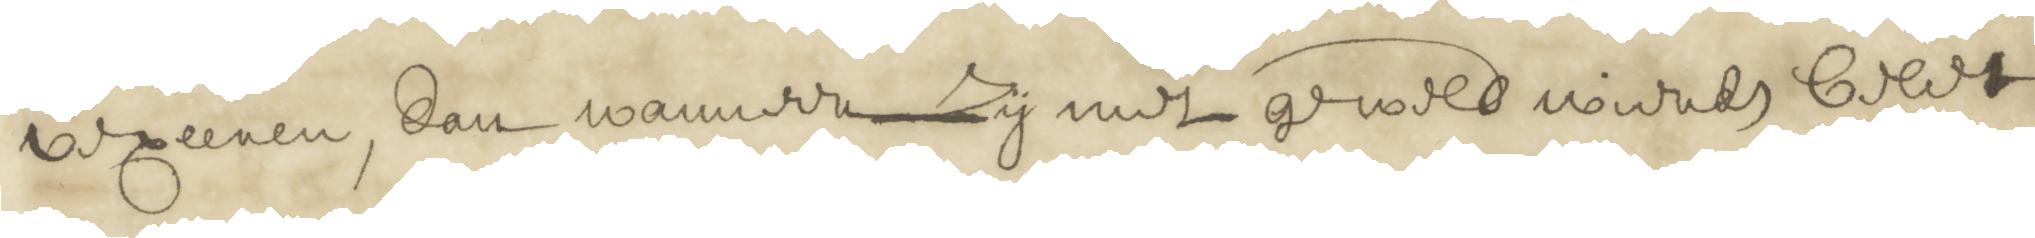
vexeeren, dan wanneer zij niet geweld wierden belet
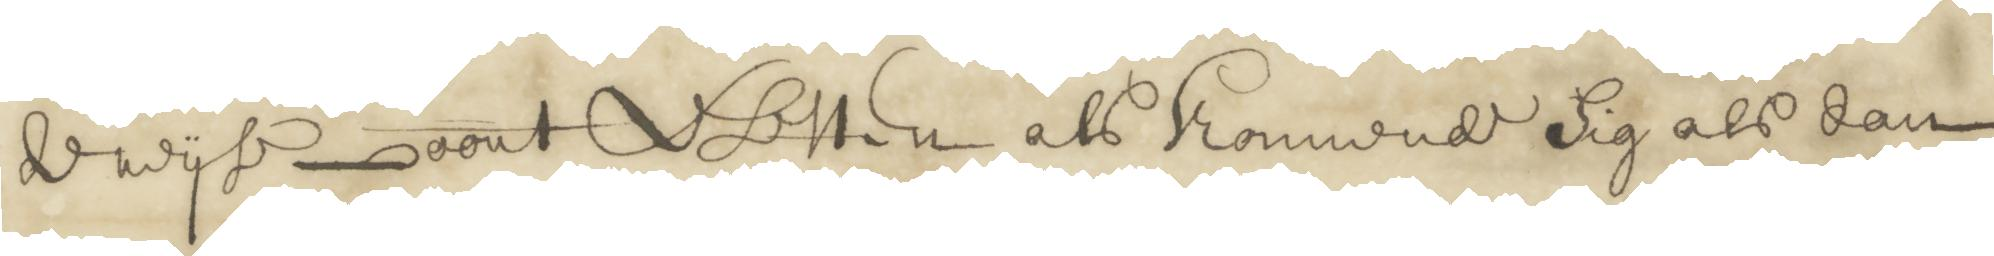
de reijse voort tesetten als konnende sig als dan
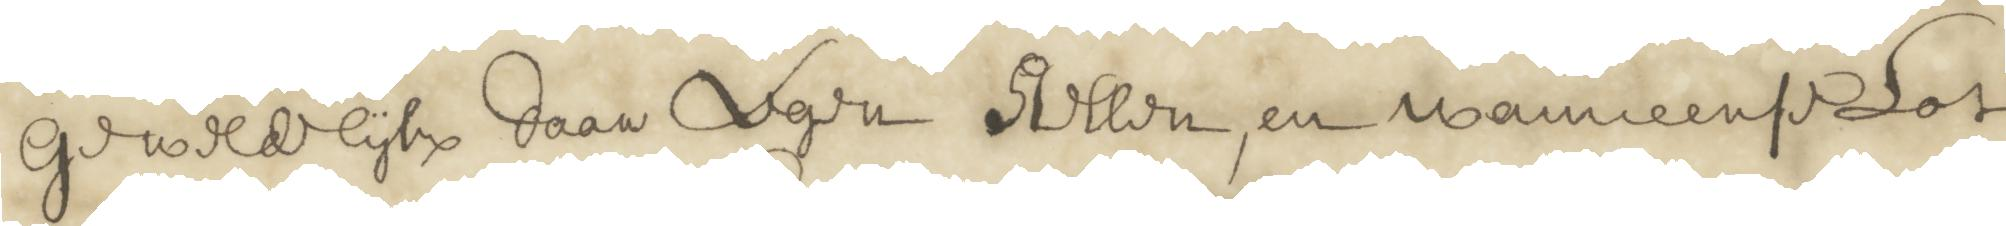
geweldelijk daar tegen stellen, en wanneerse tot
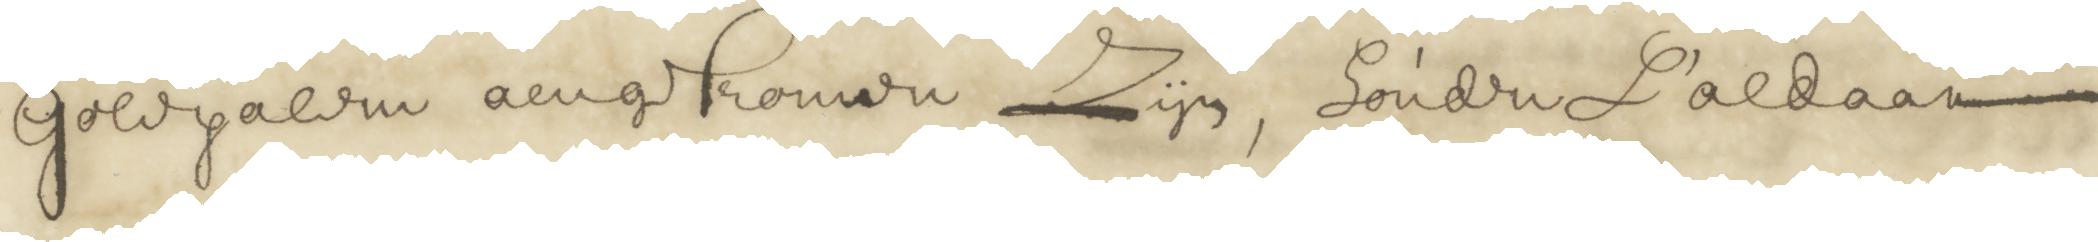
golepalem aengekomen zijn, souden s' aldaar
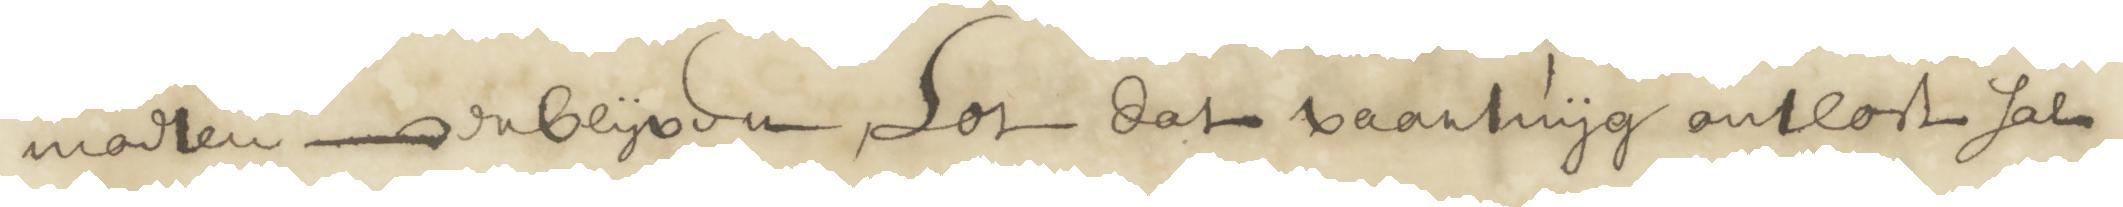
moeten verblijven, tot dat vaartuijg ontlost sal
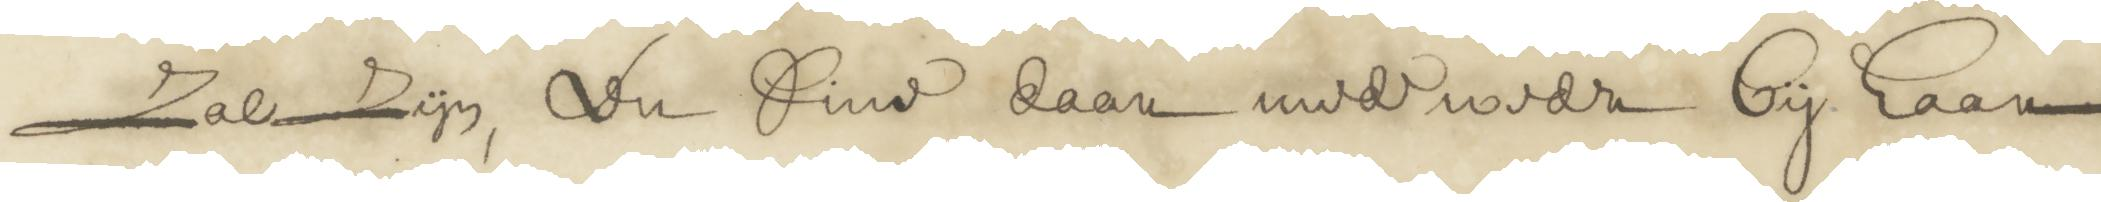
zal zijn, ten fine daar mede weder bij haar
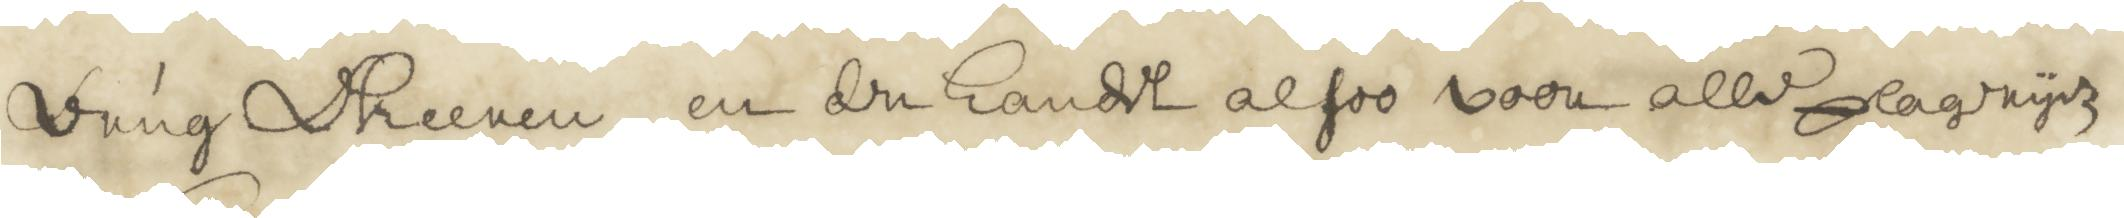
terug tekeeren, en den handel alsoo voor alle plagerijen
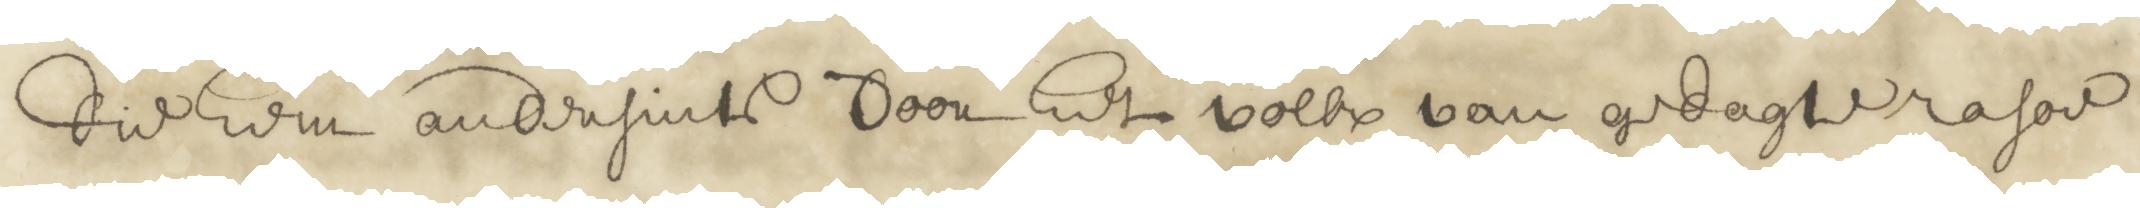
die hem andersints door het volk van gedagte rasoe
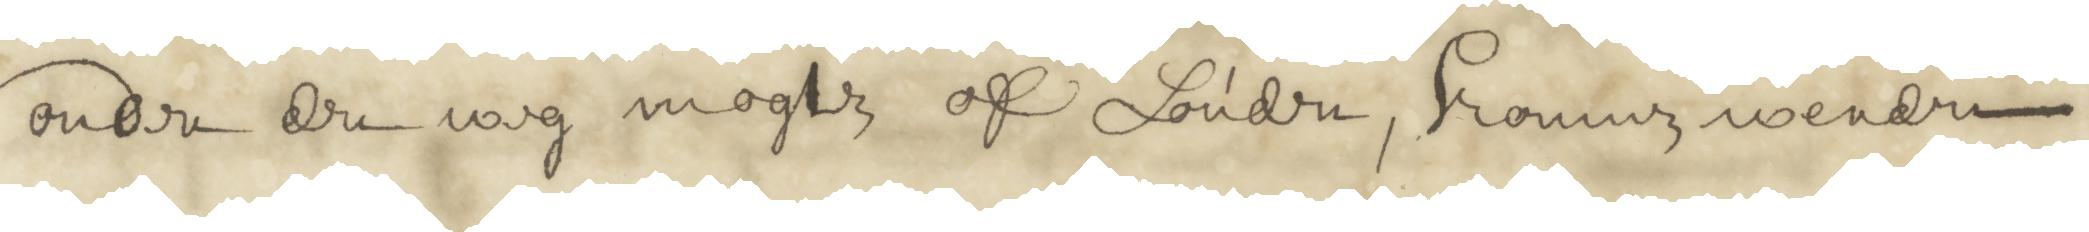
onder den weg mogten of souden, konnen werden
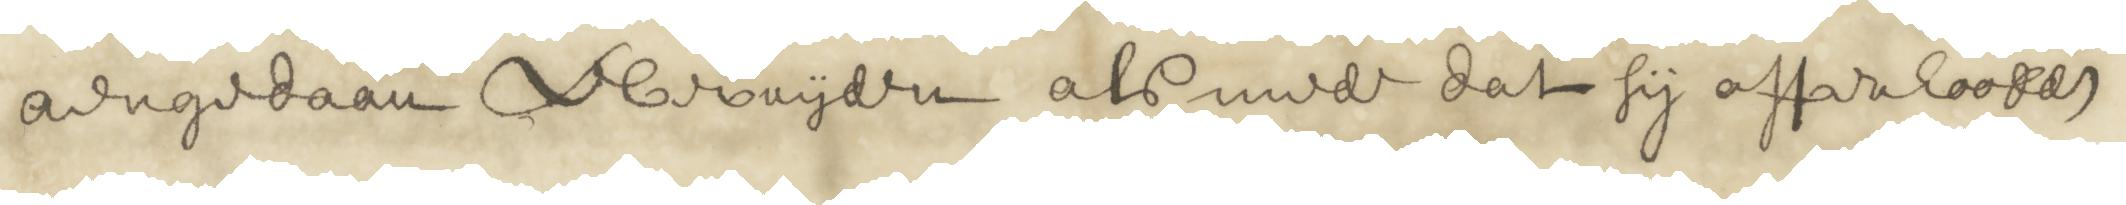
aengedaan te bevrijden als mede dat sij opperhoofden
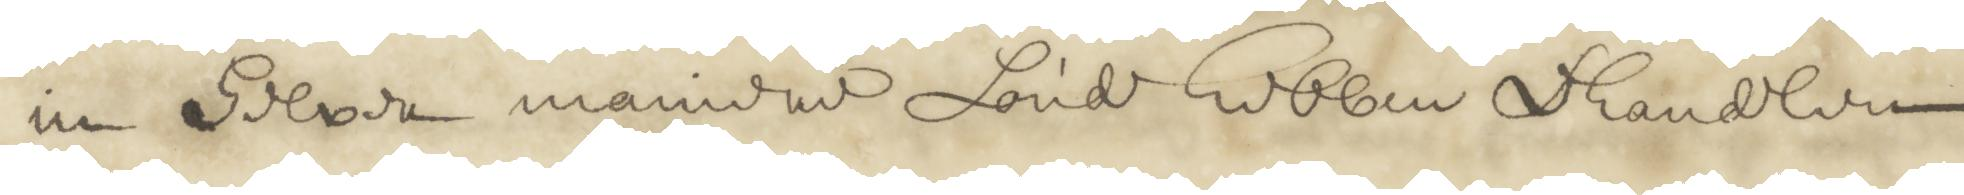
in selver maniere soude hebben tehandelen
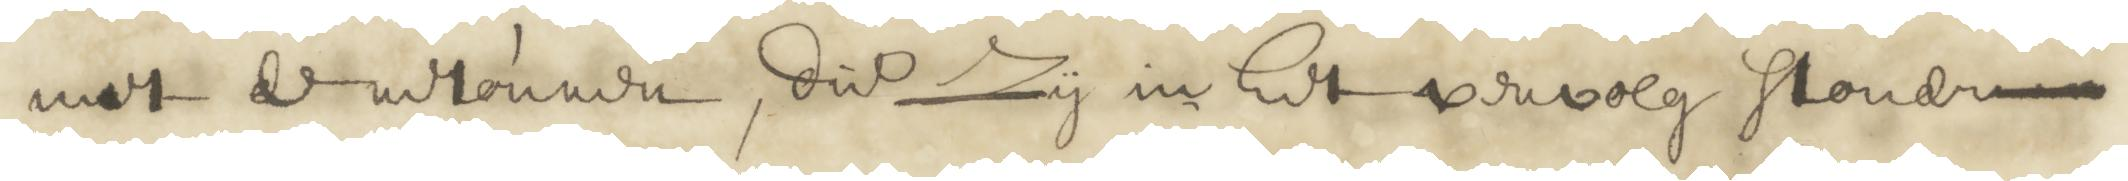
met de retouren, die zij in het vervolg stonden
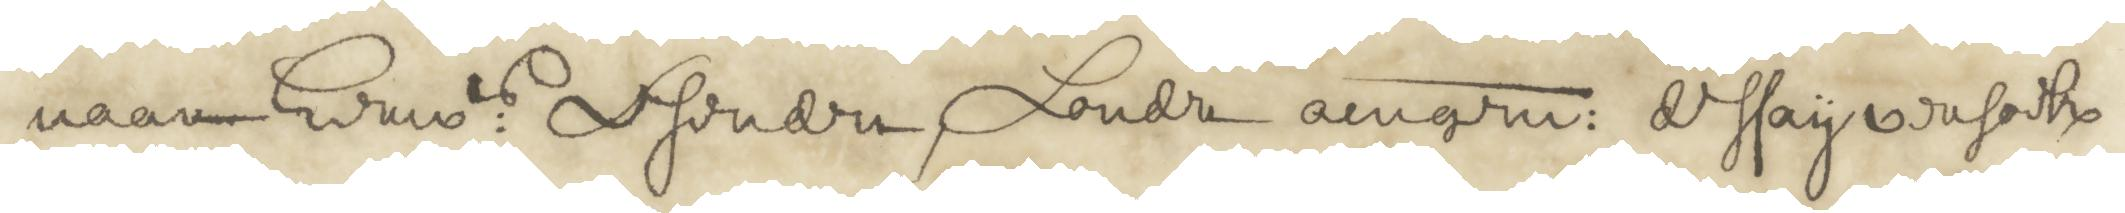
naar herw:ts tesenden, sonder aengem: dessaij versoek
